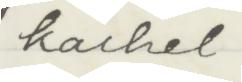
kachel
